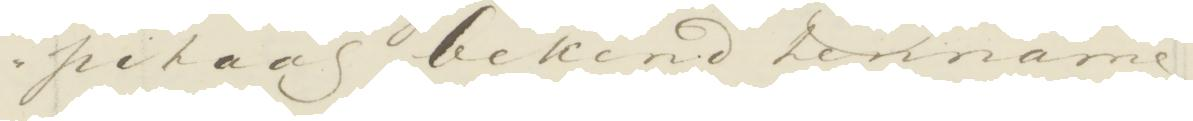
„pitaal bekend ten name
